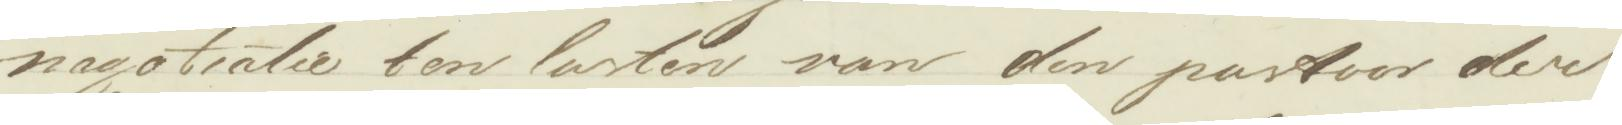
negotiatie ten lasten van den pastoor der
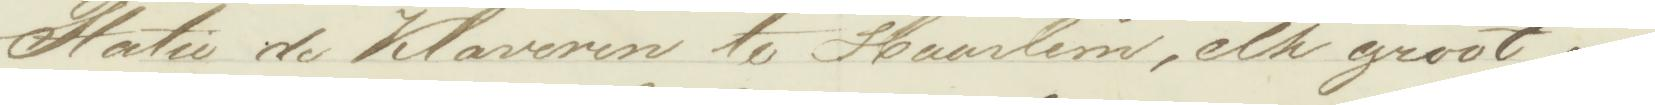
Statie de Klaveren te Haarlem, elk groot in
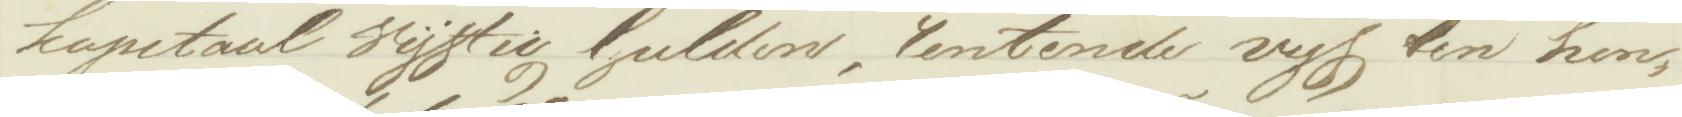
kapitaal Vijftig Gulden, rentende vyf ten hon„
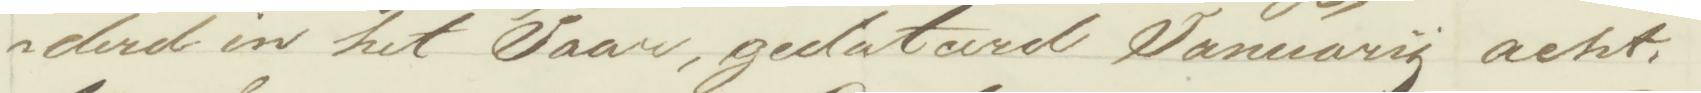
derd in het Iaar, gedateerd Ianuarij acht,
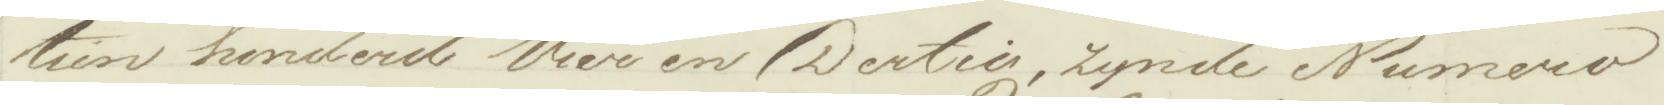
tien honderd vier en Dertig, zynde Numero
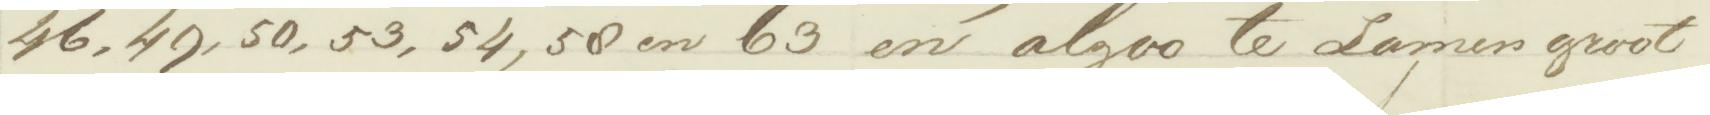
46, 49, 50, 53, 54, 58 en 63 en alzoo te zamen groot
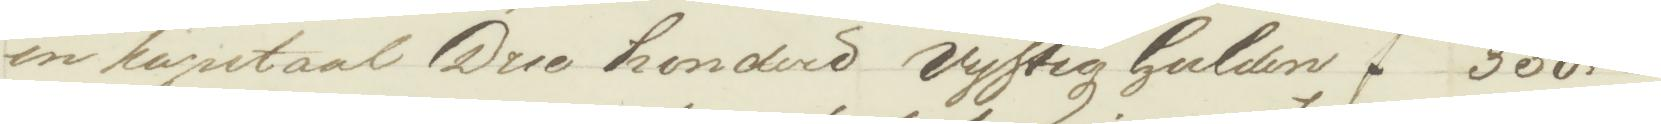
in kapitaal Drie honderd vyftig Gulden ƒ 350: –
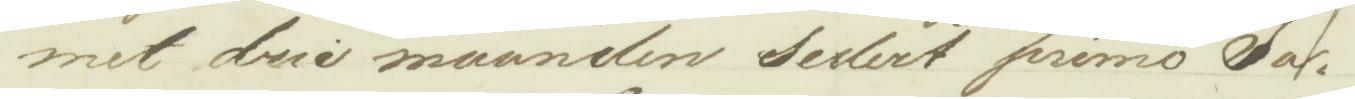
met drie maanden sedert primo Ia„
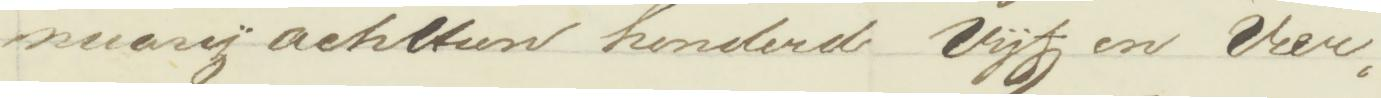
nuarij achttien honderd vijf en vier„
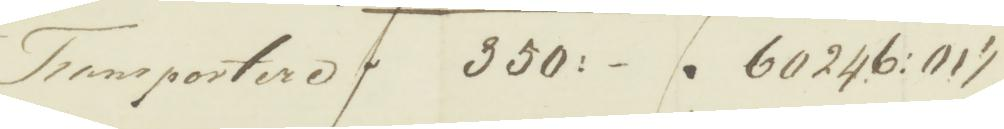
Transportere ƒ 350: – ƒ 60246:01½
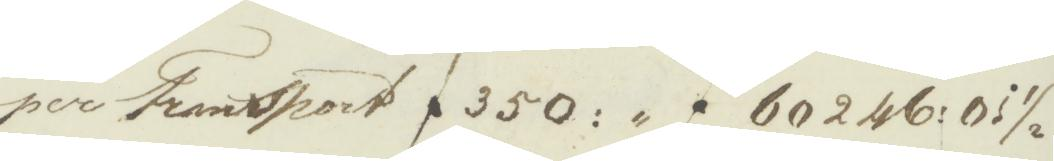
per Transport ƒ 350: „ ƒ 60246:01½
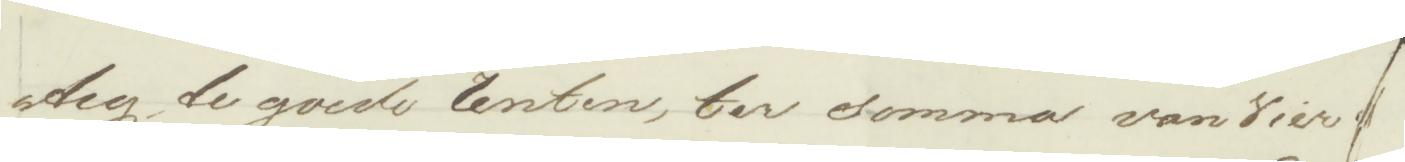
tig, de goede renten, ter somma van vier
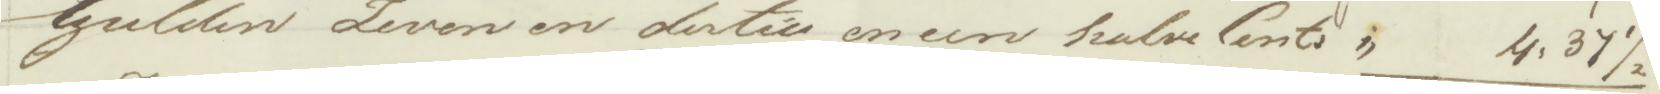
Gulden zeven en dertig en een halve Cents „ 4:37½
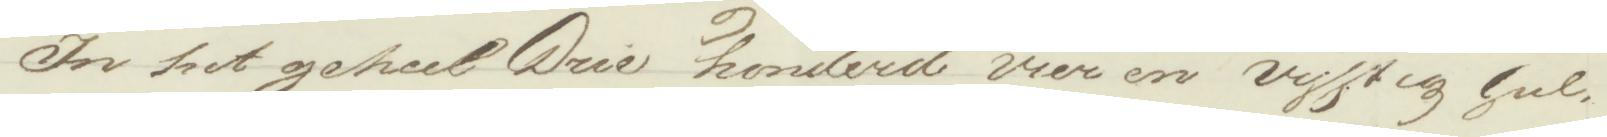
In het geheel Drie honderd vier en vyftig Gul„
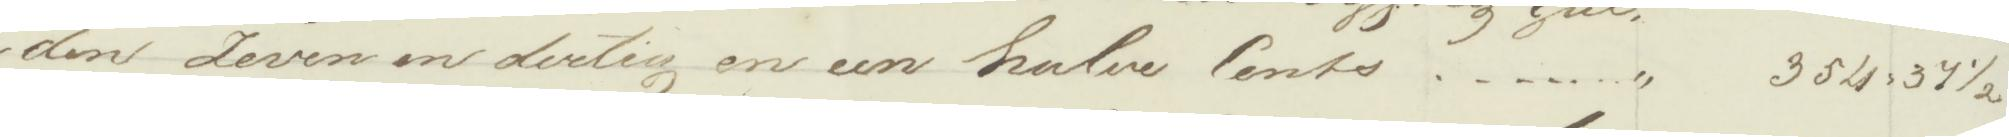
den zeven en dertig en een halve Cents . . . . . . . „ 354: 37½
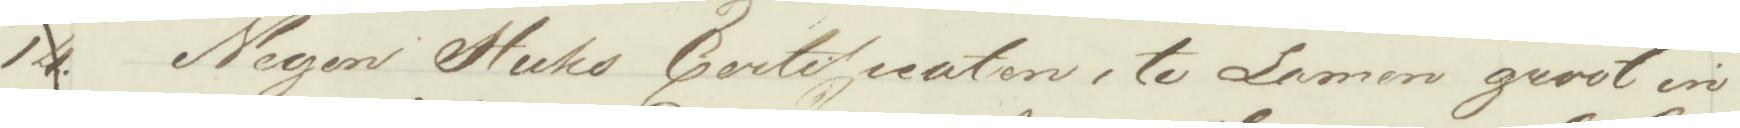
14. Negen Stuks Certificaten, te zamen groot in
